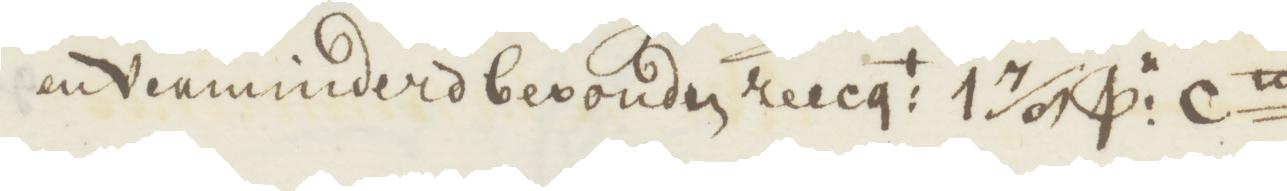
en Verminderd bevonden reecq:t 1 7/8 p:r c=t
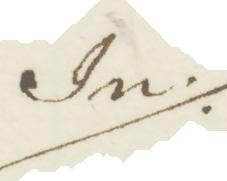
In./.
